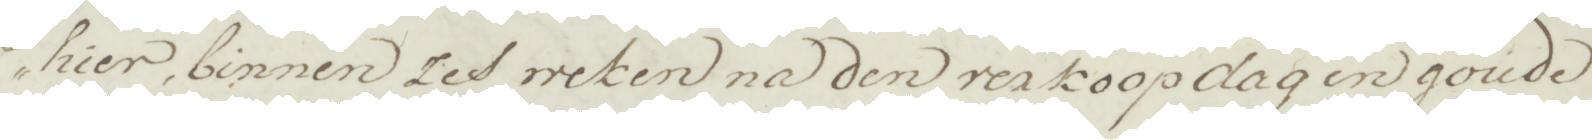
„hier, binnen zes weken na den verkoop dag in goude
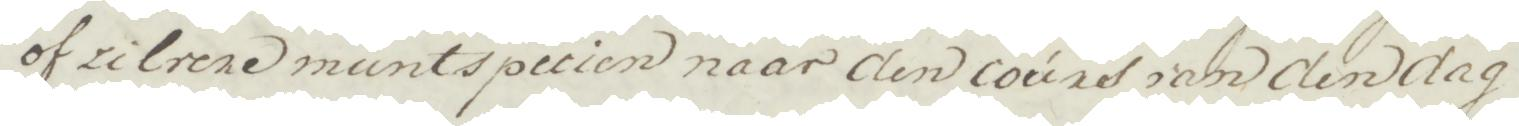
of zilvere muntspecien naar den cours van den dag
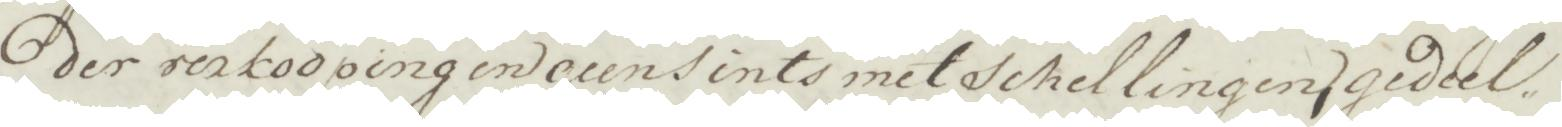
der verkooping en geensints met schellingen, gedeel„
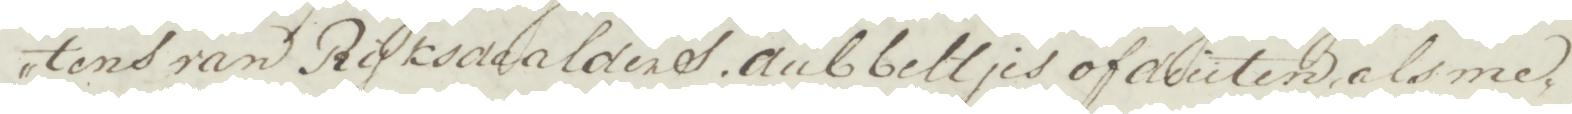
„tens van Rijksdaalders, dubbetljes of duiten, alsme„
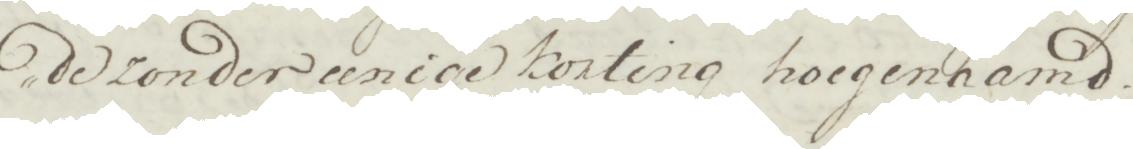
„de zonder eenige korting hoegenaamd.
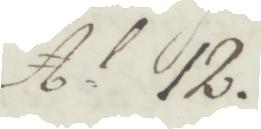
A=l 12.
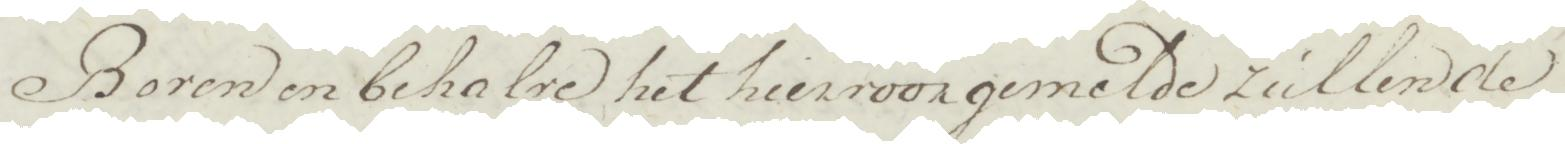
Boren en behalve het hiervoor gemelde zullen de
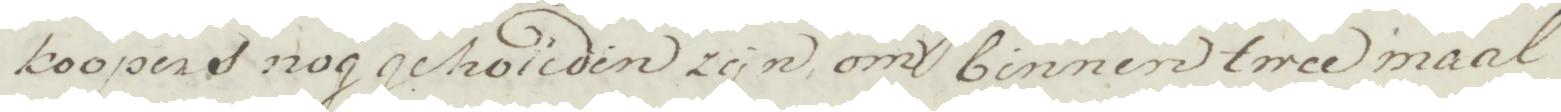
koopers nog gehouden zijn, om binnen twee maal
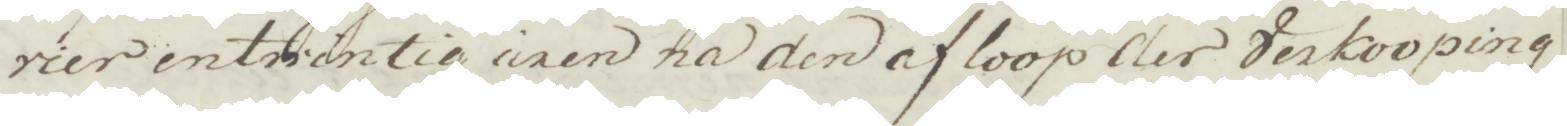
vier entwintig uren na den afloop der Verkooping
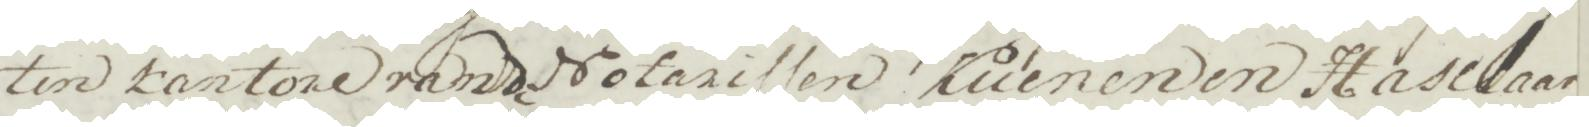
ten kantore van Notarissen Kuenen en Haselaar
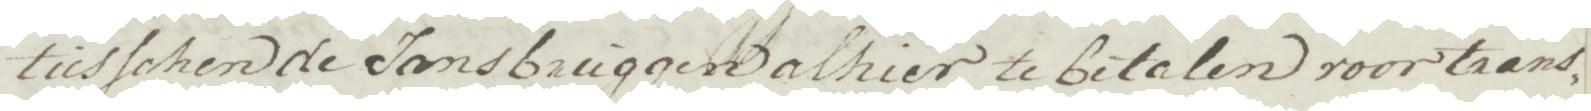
tusschen de Jansbruggen alhier te betalen voor trans„
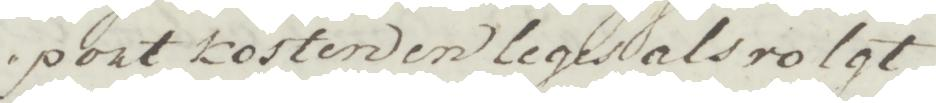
„port kosten en leges als volgt
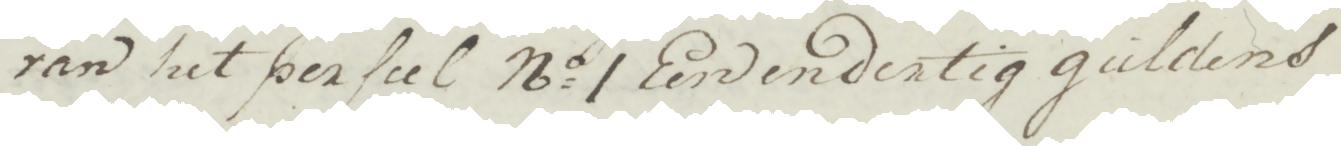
van het perceel N=o 1 Een endertig guldens
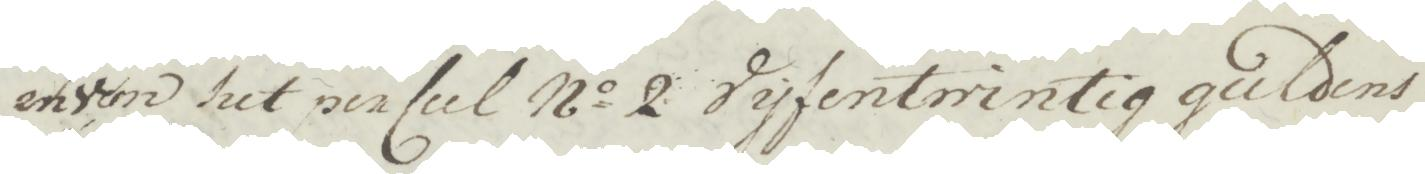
en van het perceel N=o 2 Vijfentwintig guldens
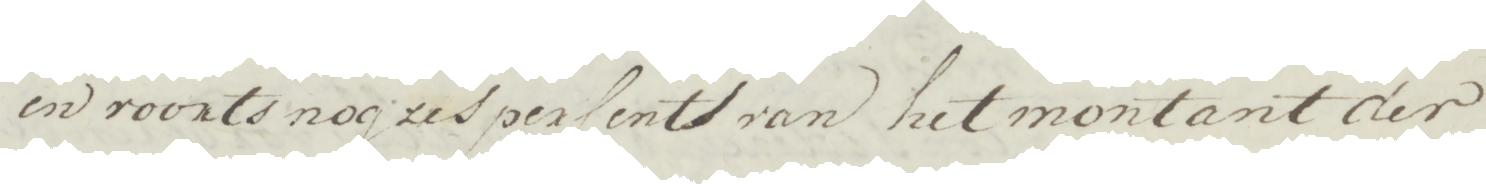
en voorts nog zes percents van het montant der
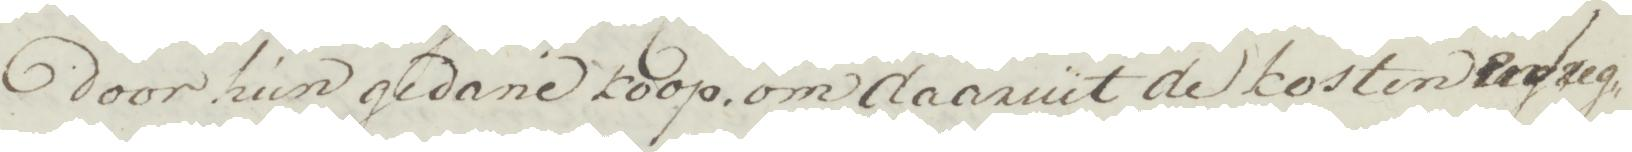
door hun gedane koop, om daaruit de kosten en reg„
